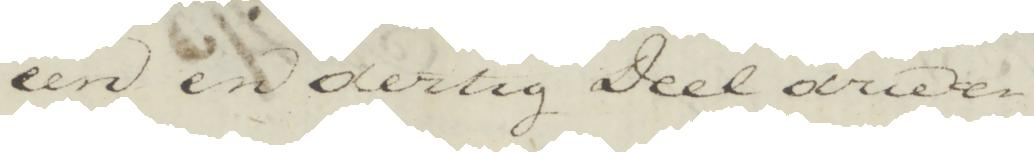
een en dertig Deel drie en
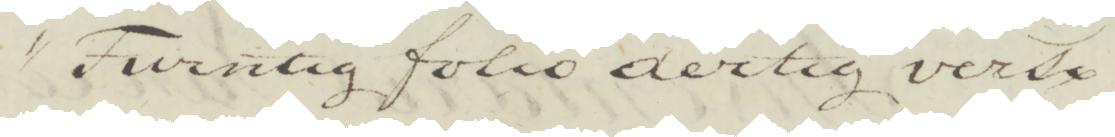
„ Twintig folio dertig verso
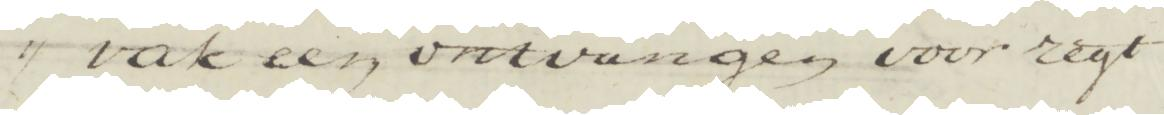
„ vak een ontvangen voor regt
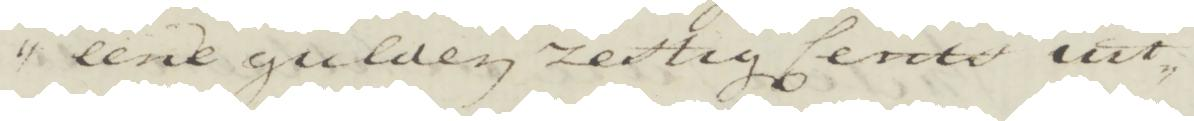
„ eene gulden zestig Cents uit„
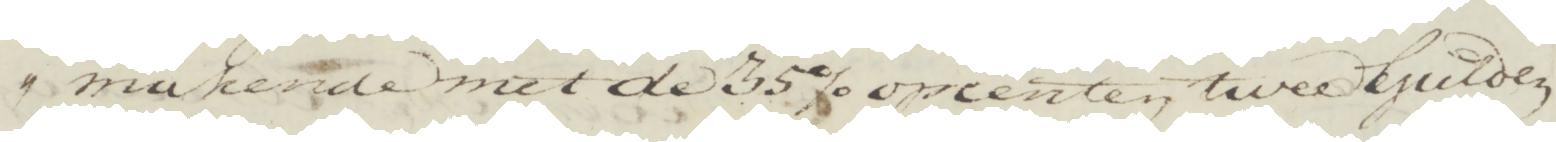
„ makende met de 35% opcenten twee Gulden
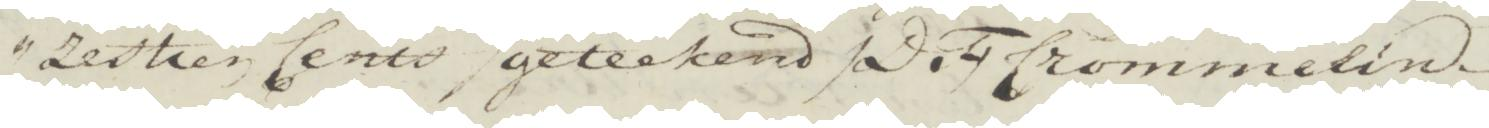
„ zestien Cents /geteekend / DF Crommelin.
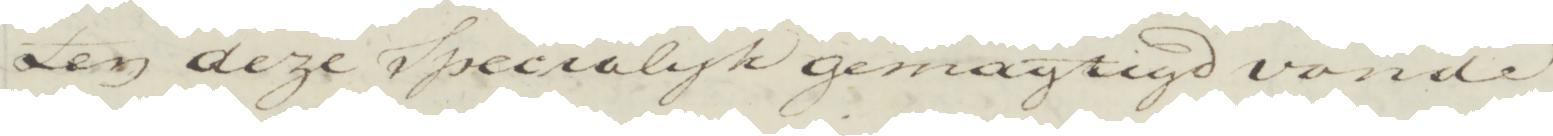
ten deze specialyk gemagtigd van de
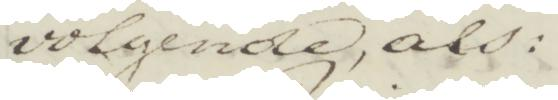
volgende, als:
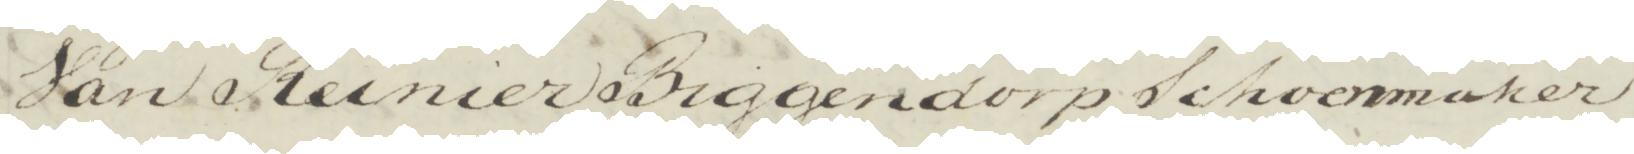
Van Reinier Biggendorp, Schoenmaker
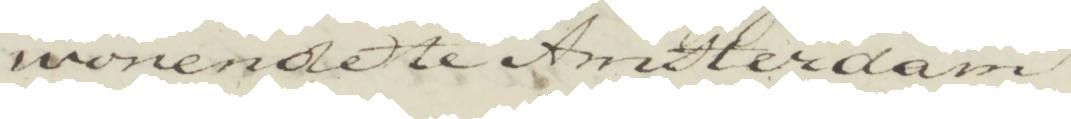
wonende te Amsterdam.
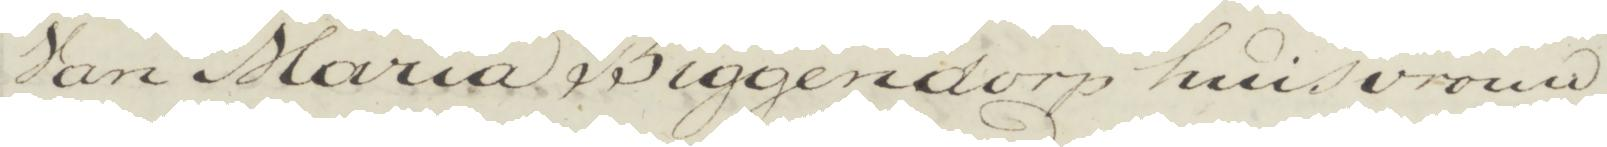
Van Maria Biggendorp huisvrouw
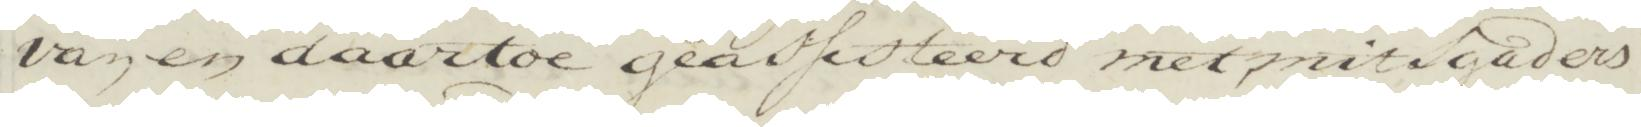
van en daartoe geassisteerd met, mitsgaders
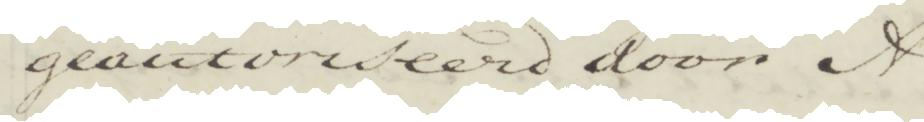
geautoriseerd door A
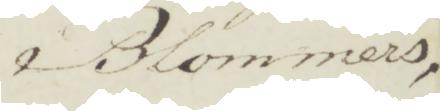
Blommers,
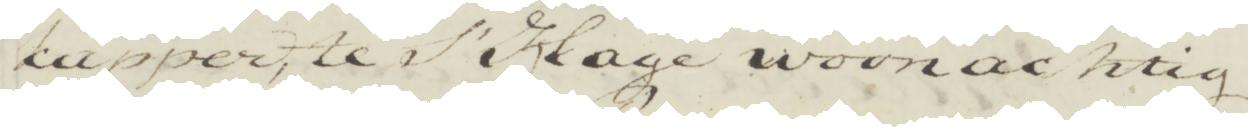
kapper, te s'Hage woonachtig
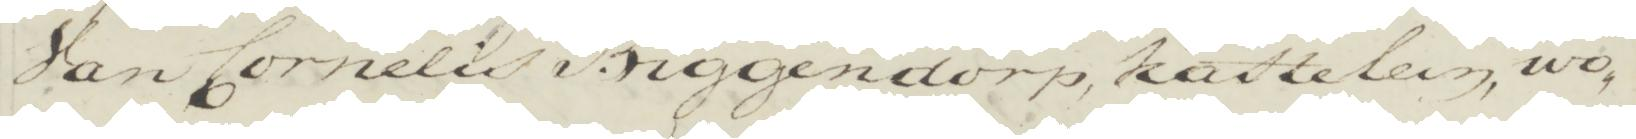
van Cornelis Biggendorp, kastelein, wo„
